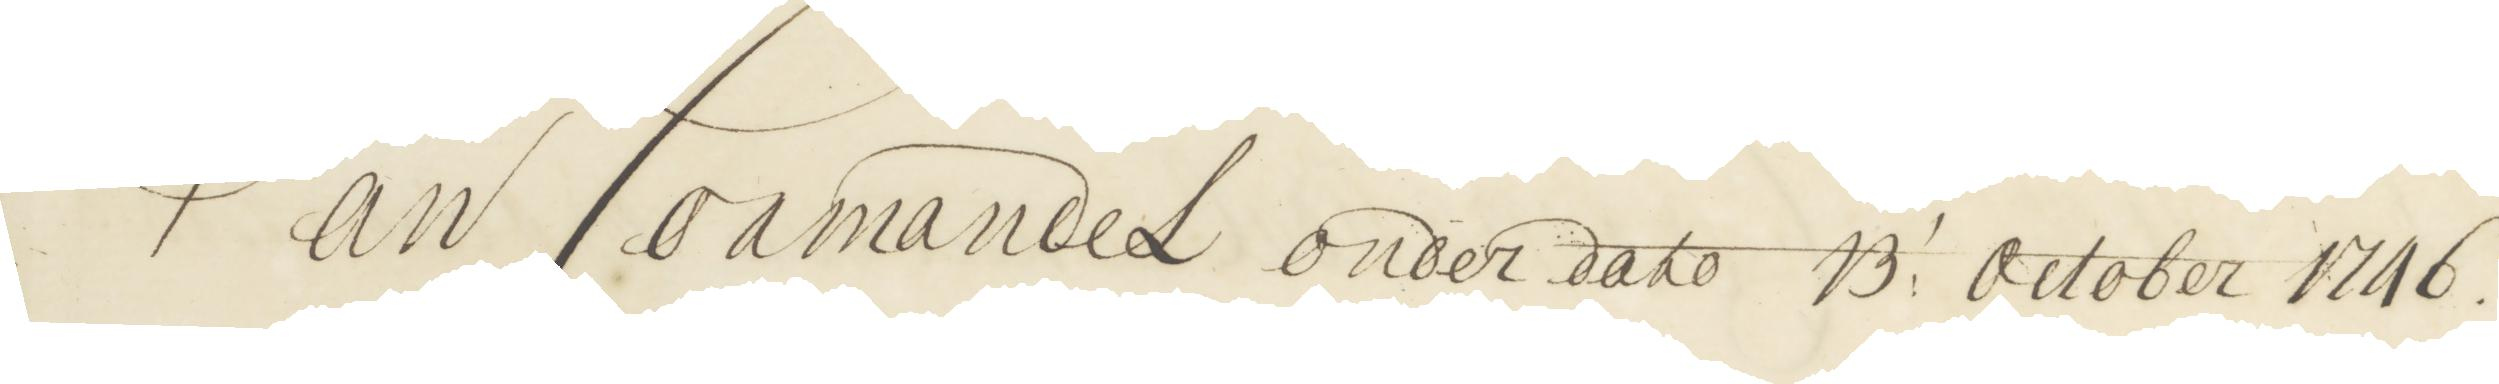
Van Cormandel onder dato 13:' October 1746.
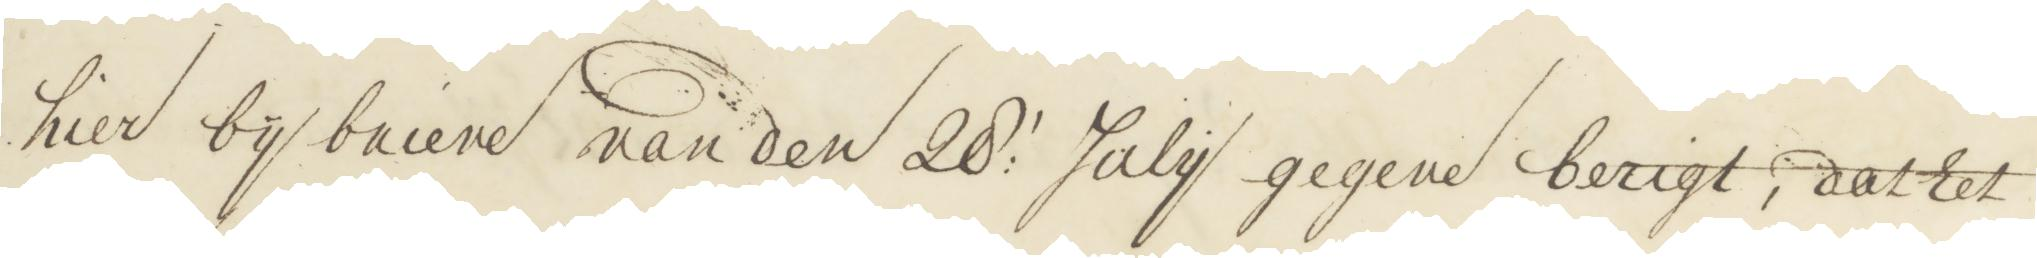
hier bij brieve van den 28:' Julij gegeve berigt, dat het
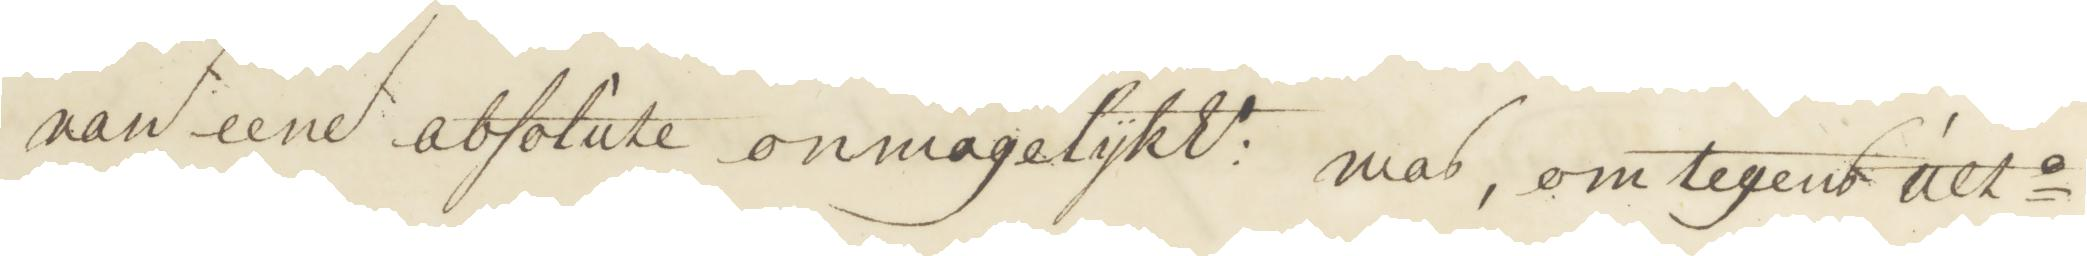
van eene absolute onmogelijkh:t was, om tegens ult=o
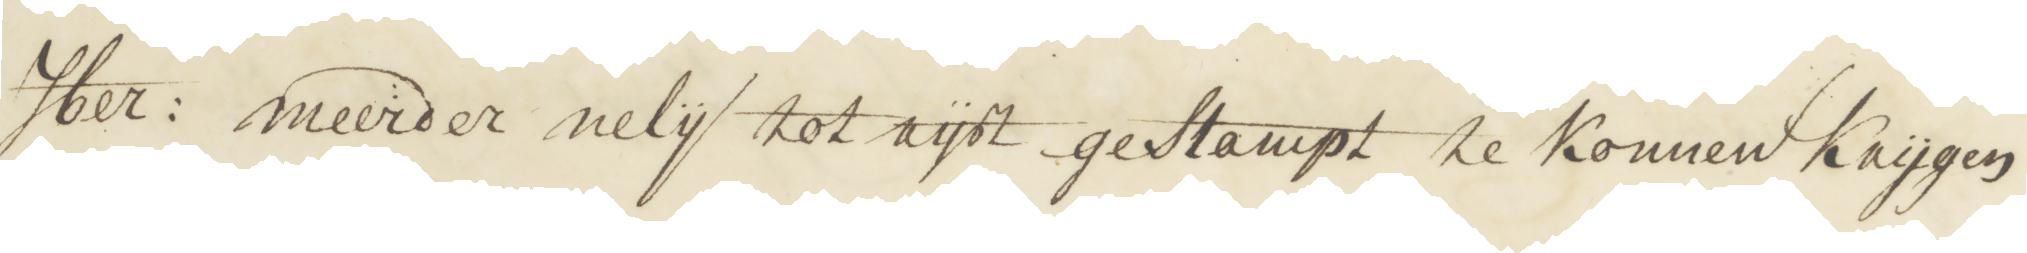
Jber: meerder nelij tot rijst gestampt te konnen krijgen
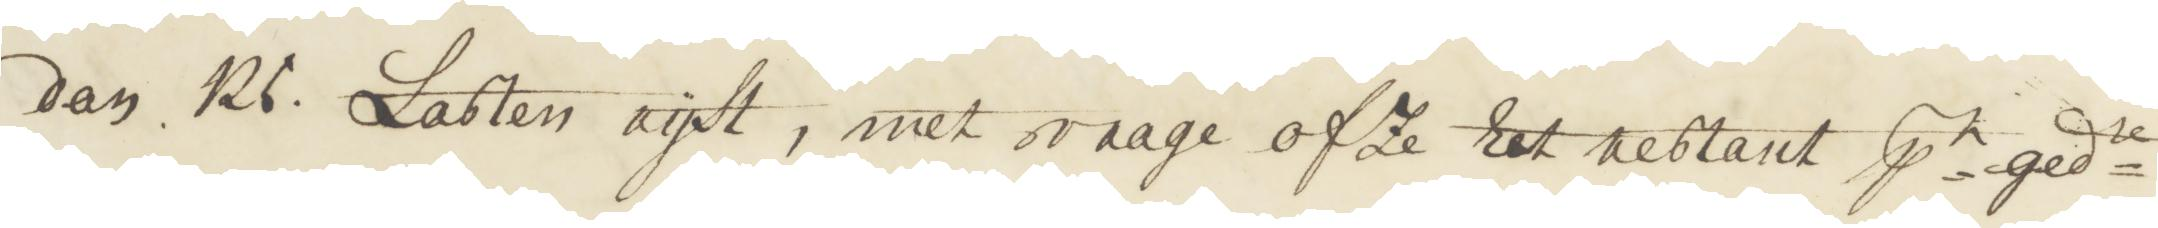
dan 125. Lasten rijst, met vrage ofze het restant p=r ged=te
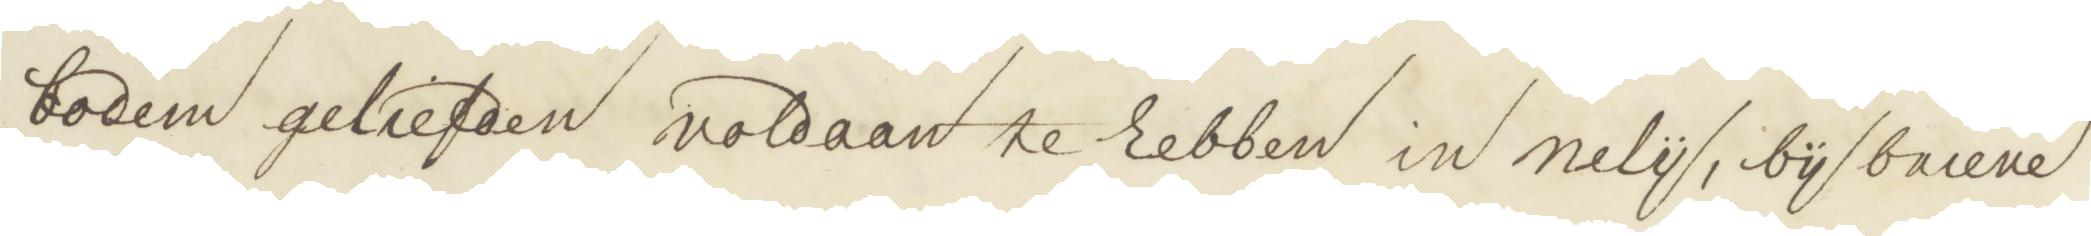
bodem geliefden voldaan te hebben in nelij, bij brieve
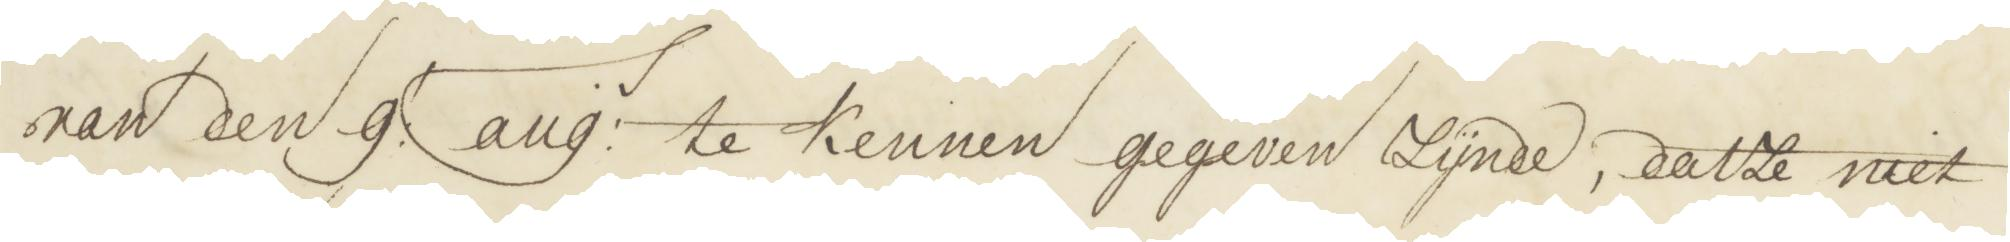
van den 9:' aug:s te kennen gegeven zijnde, datze niet
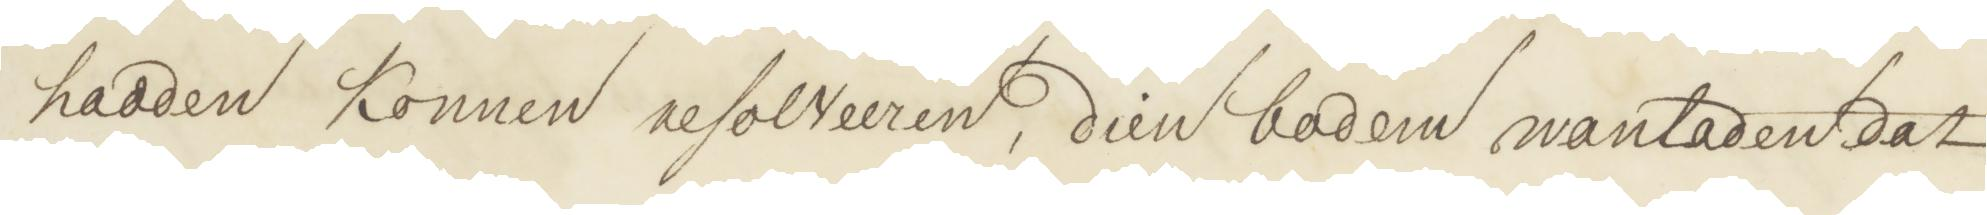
hadden konnen resolveeren, dien bodem wanladen dat
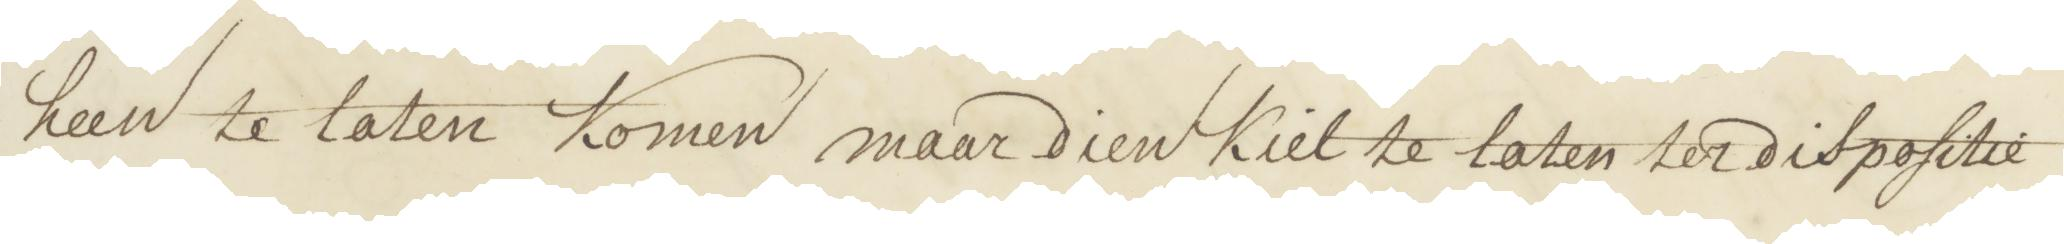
heen te laten komen maar dien kiel te laten ter dispositie
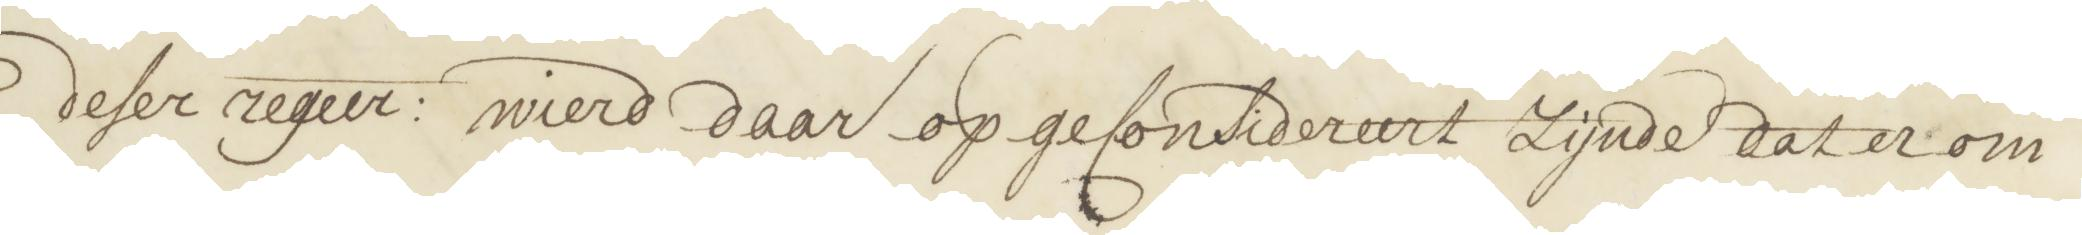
deser regeer: wierd daar op geconsidereert zijnde dat er om
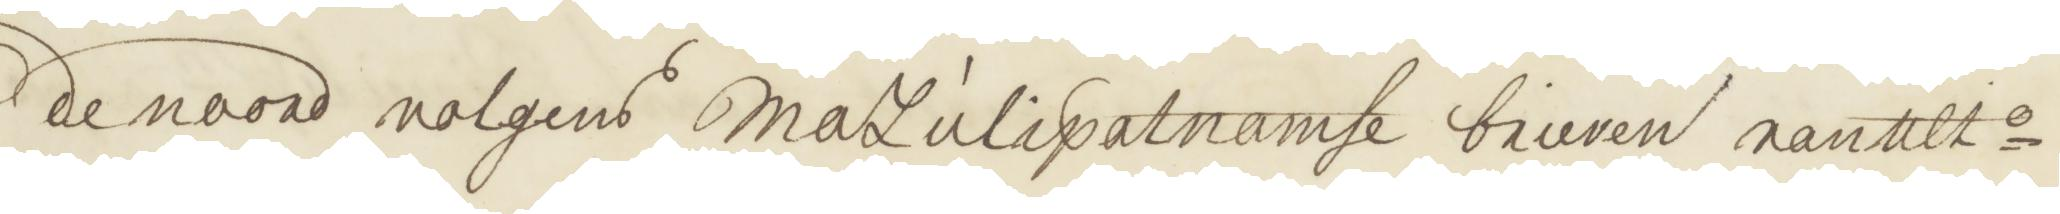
de noord volgens mazulipatnamse brieven van ult=o
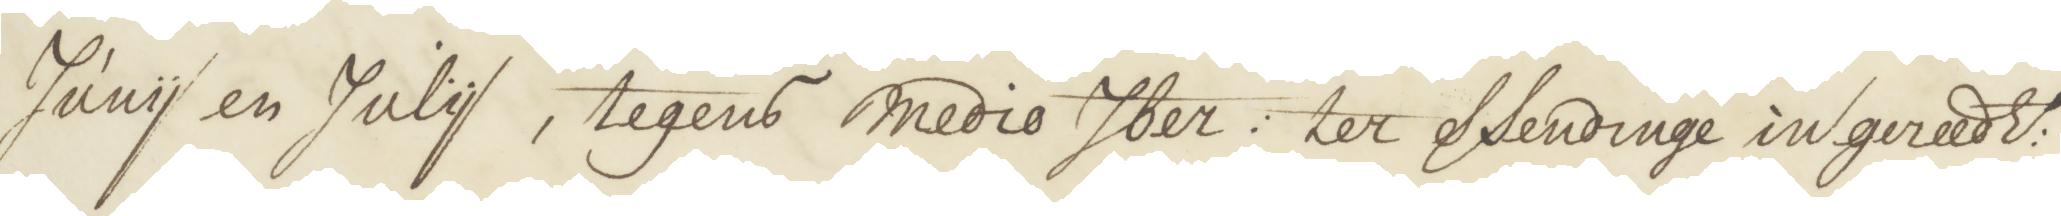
Junij en Julij, tegens medio Jber: ter versendinge in gereedh:
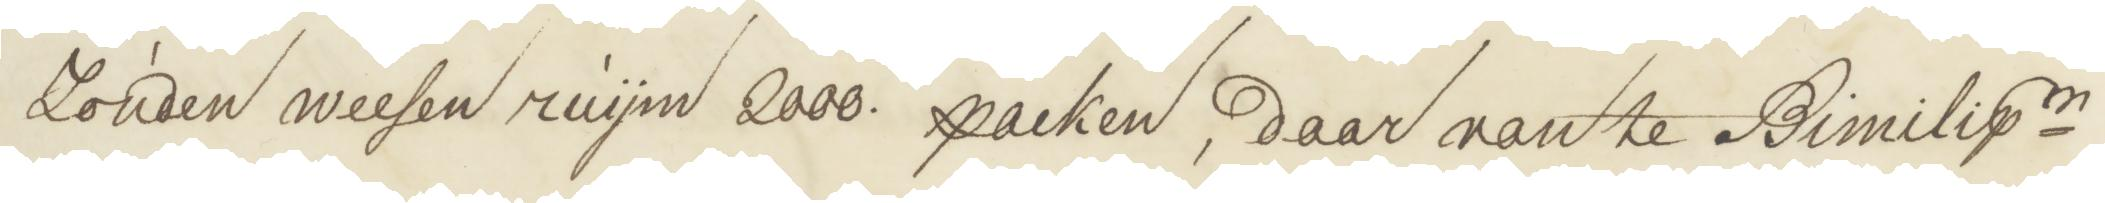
zouden weesen ruijm 2000. packen, daar van te Bimilip=m
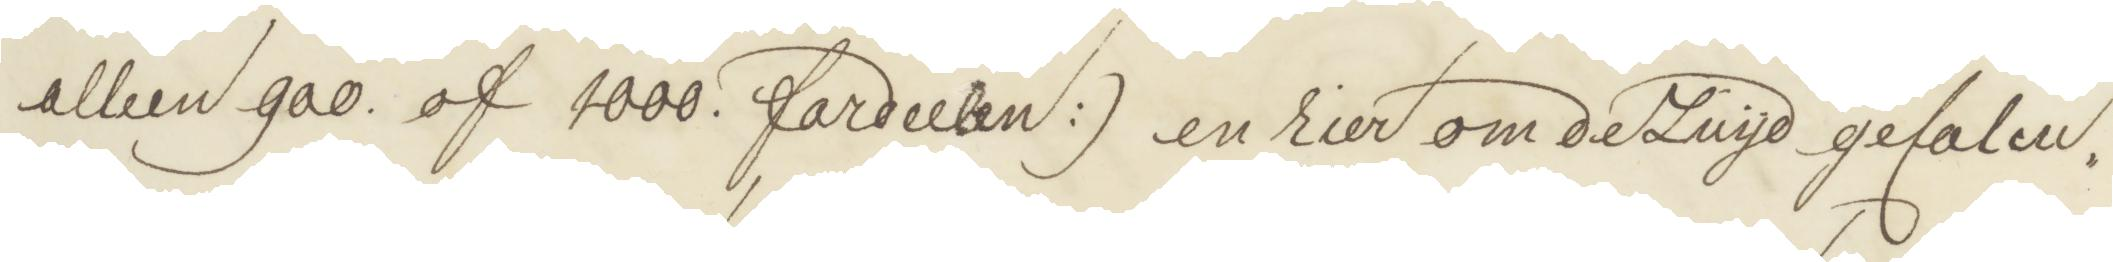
alleen 900. of 1000. fardeelen:) en hier om de zuijd gecalcu„
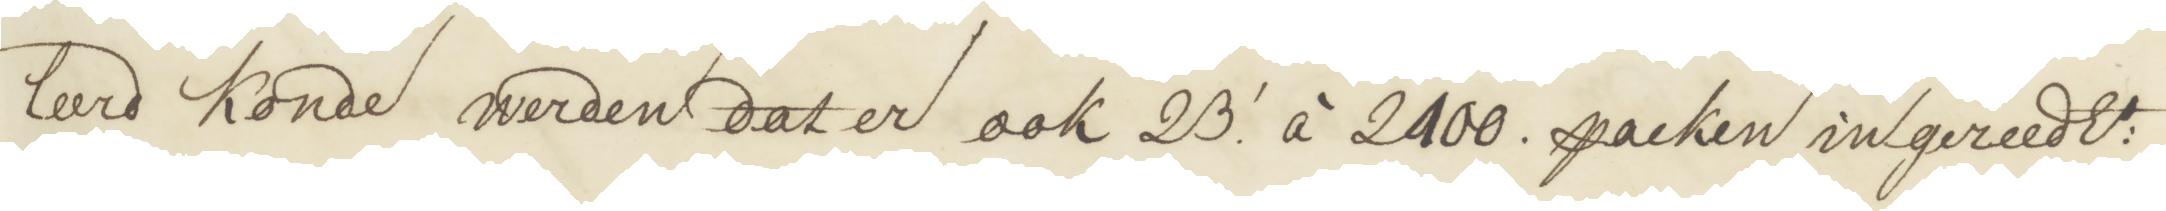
leerd konde werden dat er ook 23: à 2400. packen in gereedh:t
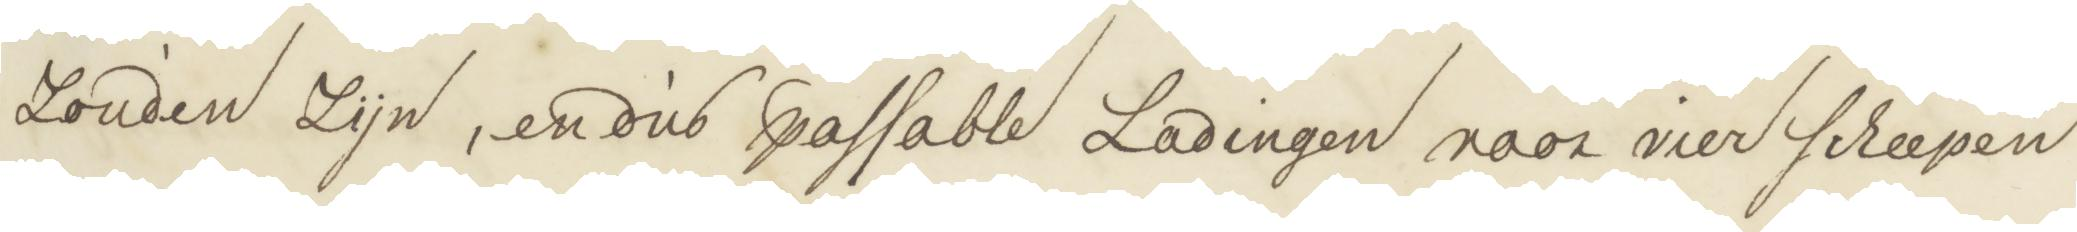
zouden zijn, en dus passable Ladingen voor vier scheepen
